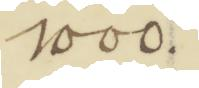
1000.
